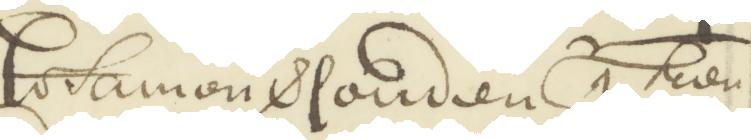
te samen versonden p=ken
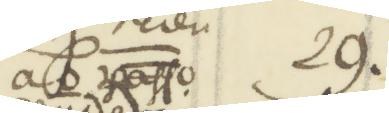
a-o passo 29.
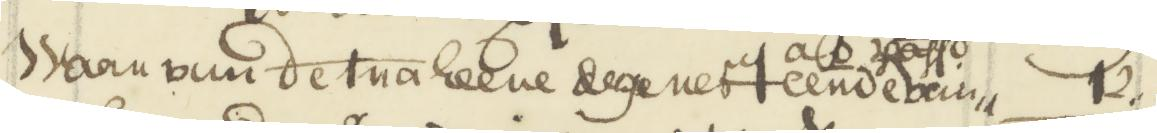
Waar van de traheene deze resteerde van„ 12.
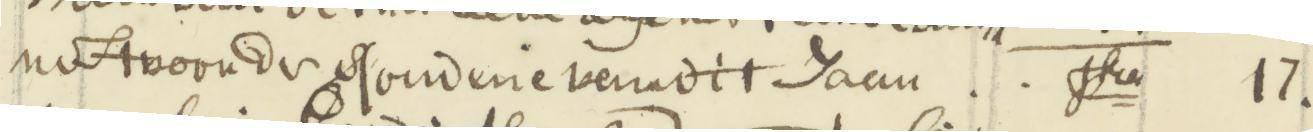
rest voor de versondene vendit Iaar - - p=kn 17.
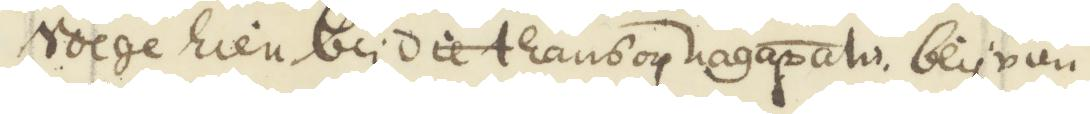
voege hier bij die thans op nagapatn. blijven
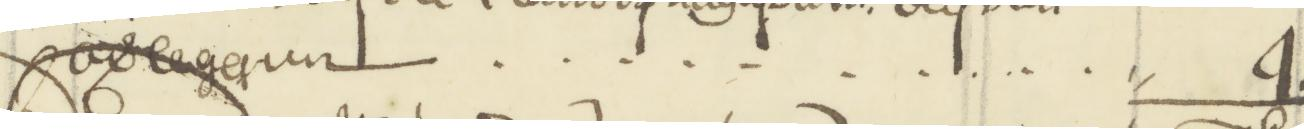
overleggen - - - - - - - - - „ 4
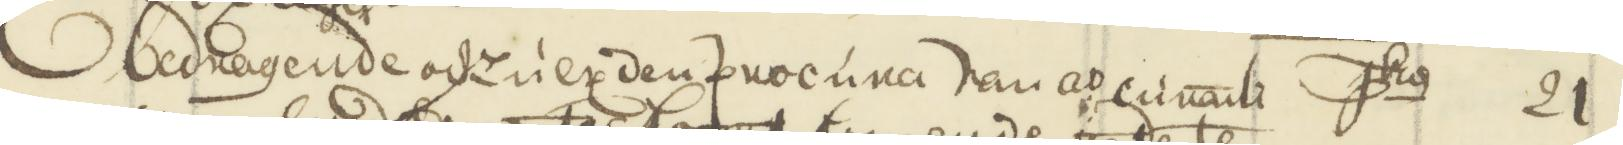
bedragende overzulx den procura van a„o curant pke 1
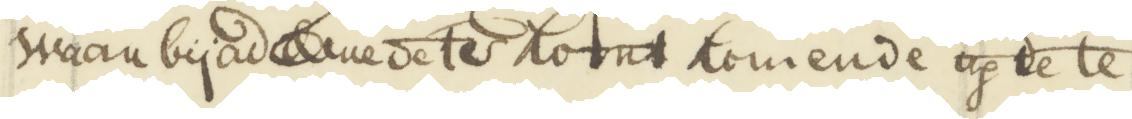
waar bij advernede ter soort komende op de te
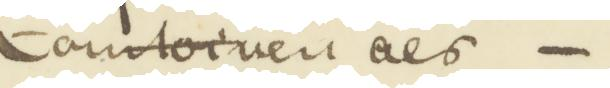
Comtoiren als —
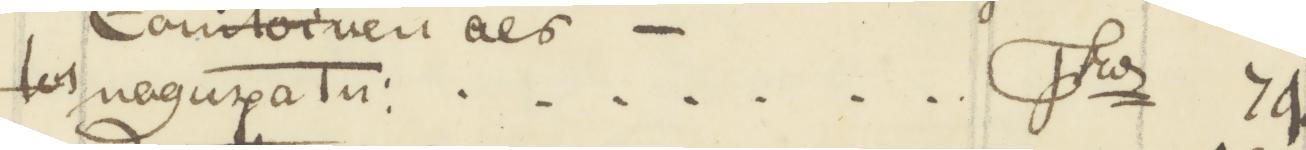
tot nagupatn: - - - - - - - p=ken 74.
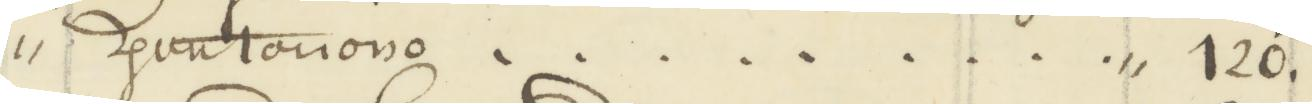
„ portonovo - - - - - - - - - - „ 120.
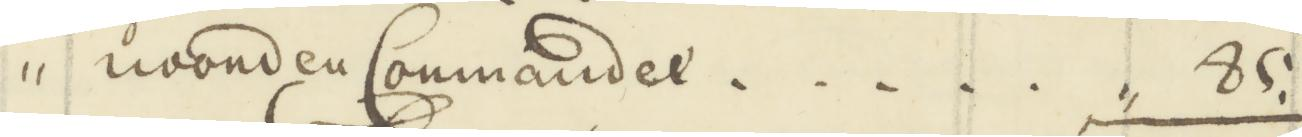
„ noorder Cormandel - - - - - „ 85:
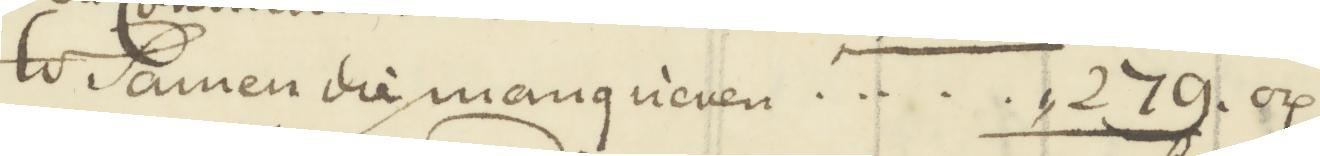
te samen die manqueren - - - - - „279. op
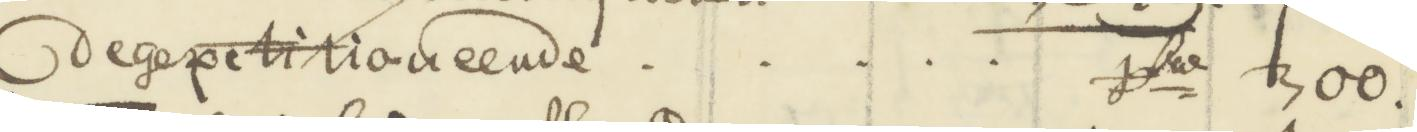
degepetitioneerde - - - - - p=ken 300.
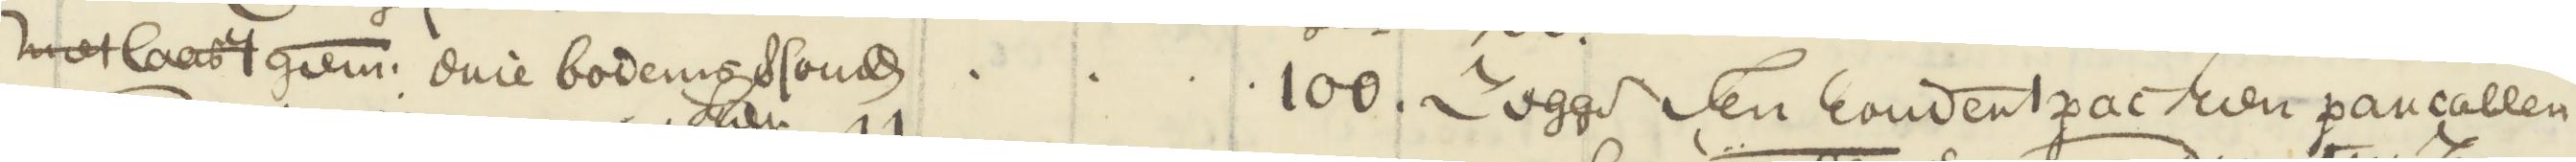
met laast gem: drie bodems versonden - - - - 100. Zegge Een hondert packen pancallen
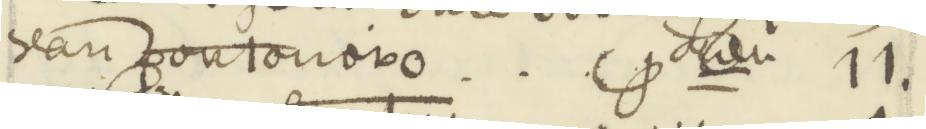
van portonovo - - - p=ken 11.
